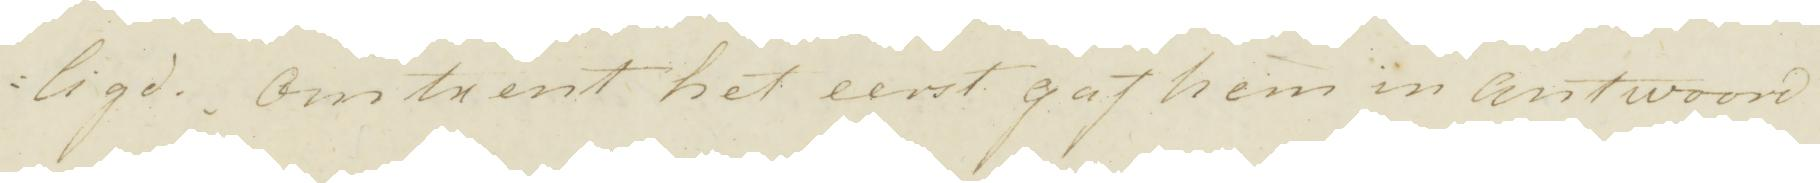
=ligd. omtrent het eerst gaf hem in antwoord
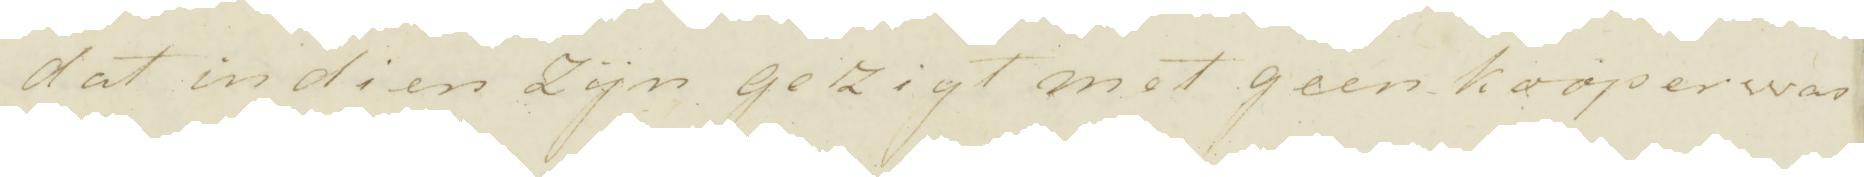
dat indien zijn gezigt met geen kooper was
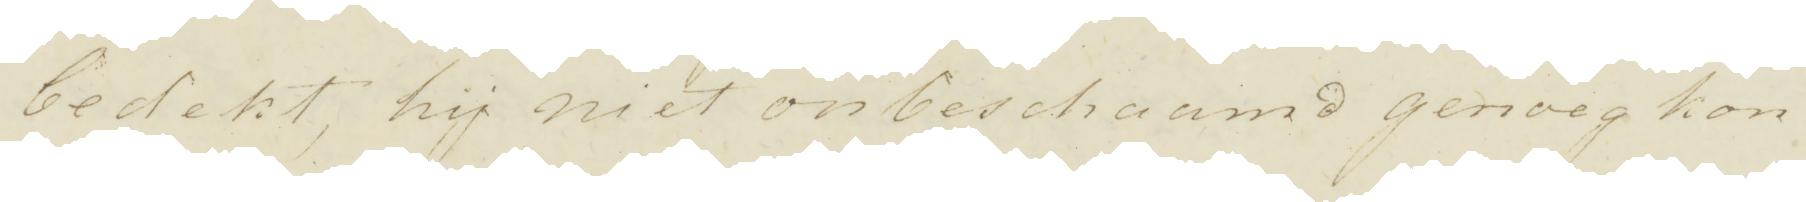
bedekt, hij niet onbeschaamd genoeg kon
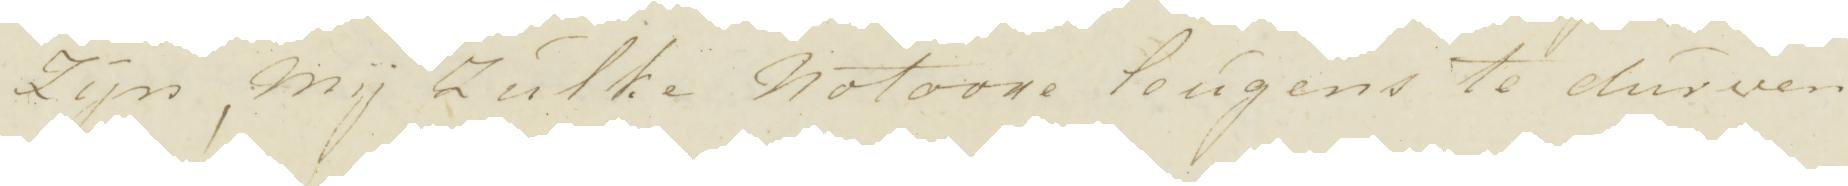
zijn, mij zulke notoore leugens te durven
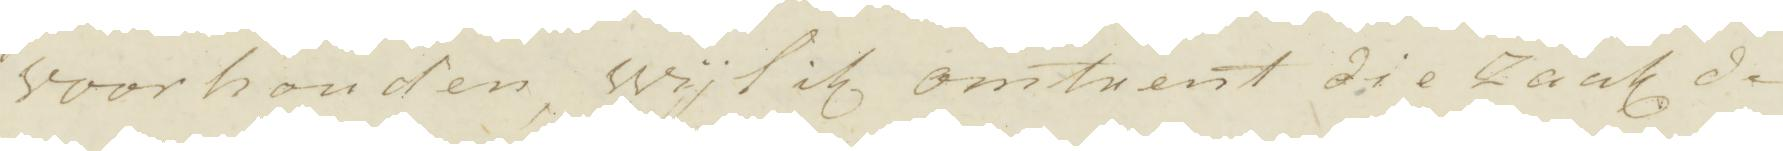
voorhouden, wijl ik omtrent die zaak de
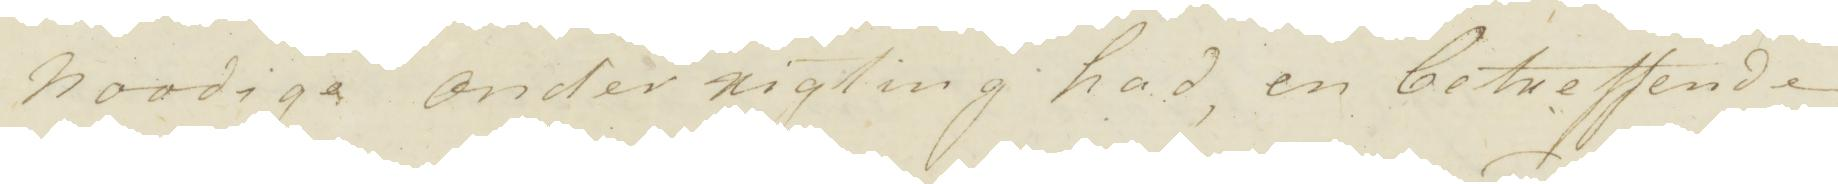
noodige onder rigting had, en betreffende
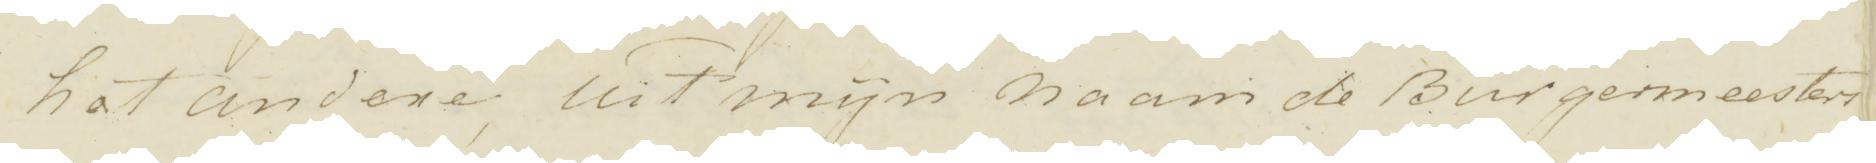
het andere uit mijn naam de Burgermeesters
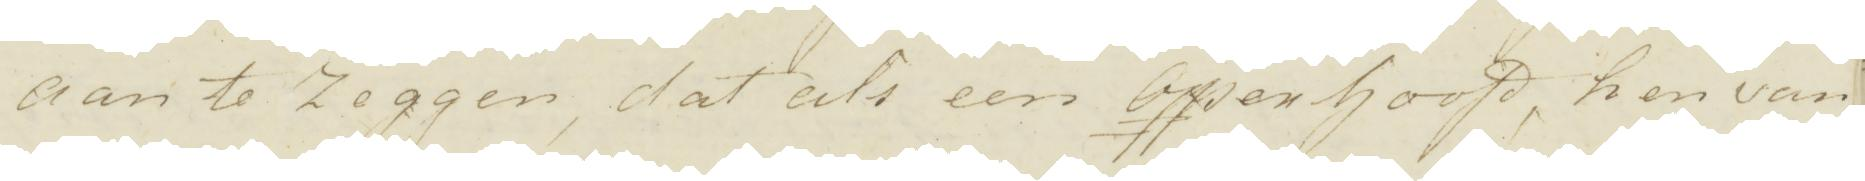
aan te zeggen, dat als een opperhoofd, hen van
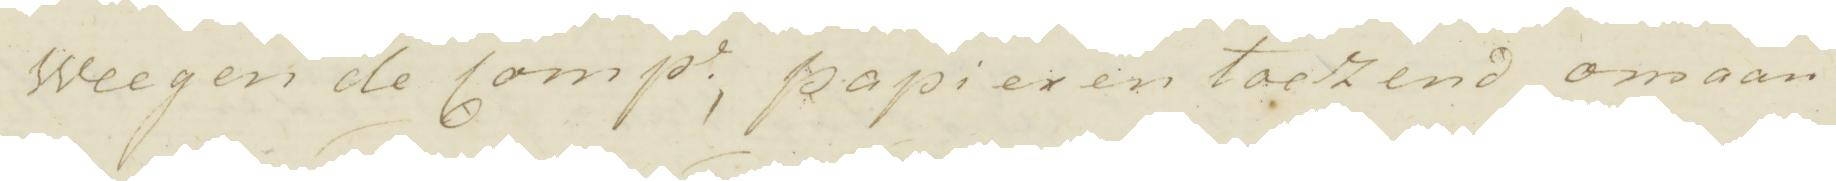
weegen de Comp:s papieren toezend om aan
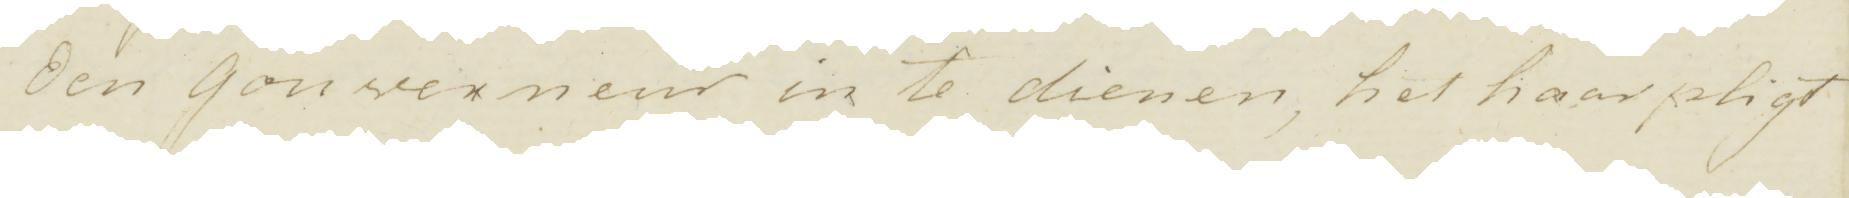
den gouverneur in te dienen, het haar pligt
